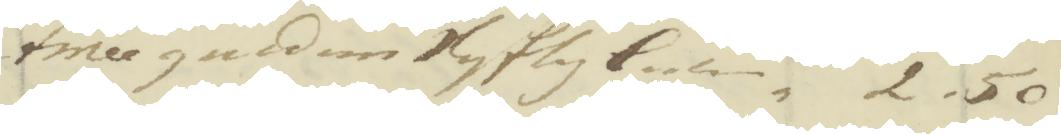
twee guldens Vyftig Cent „ 2. 50
